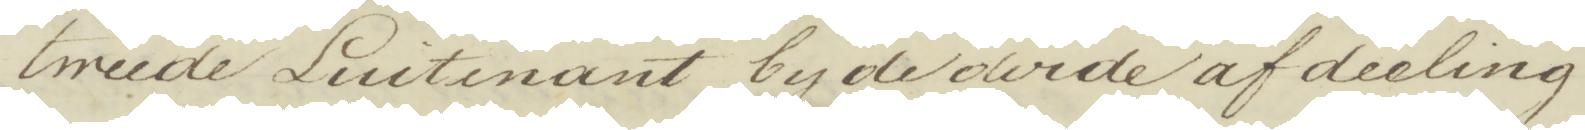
tweede Luitenant by de derde afdeeling
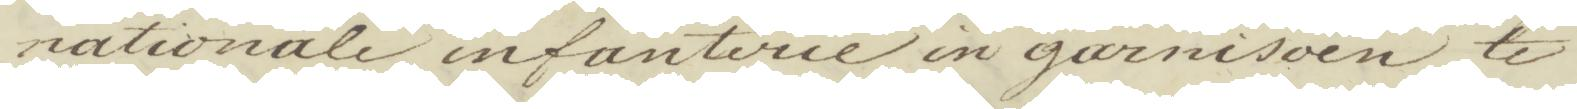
nationale infanterie in garnisoen te
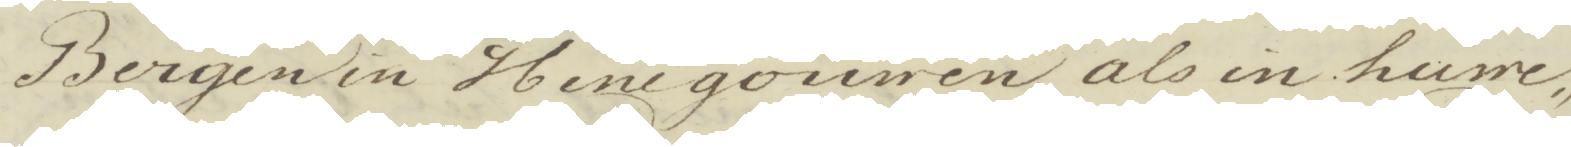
Bergen in Henegouwen, als in huwe
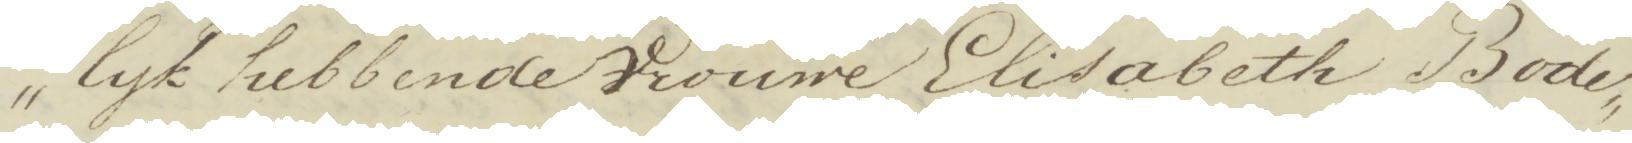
„ lyk hebbende Vrouwe Elisabeth Bode„
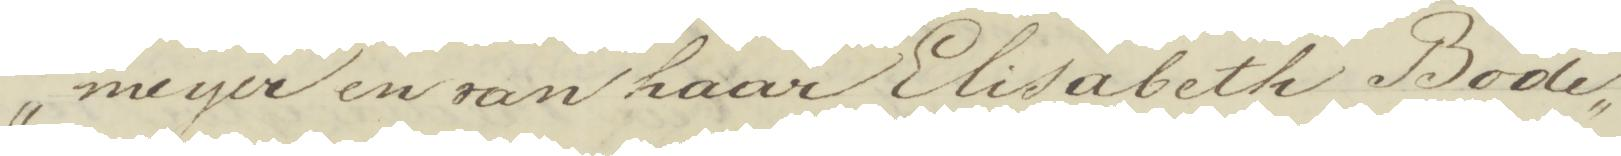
„ meijer en van haar Elisabeth Bode„
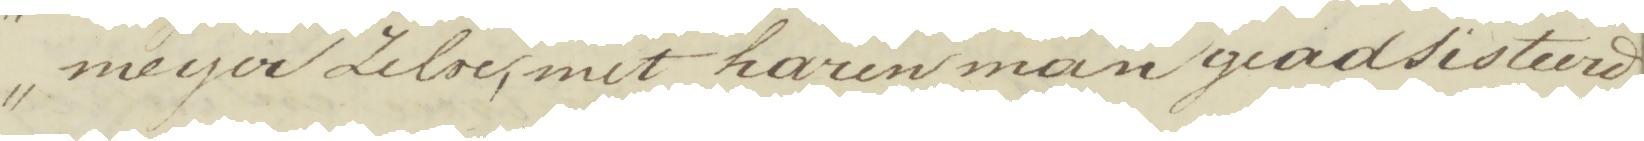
„ meijer zelve, met haren man geadsisteerd
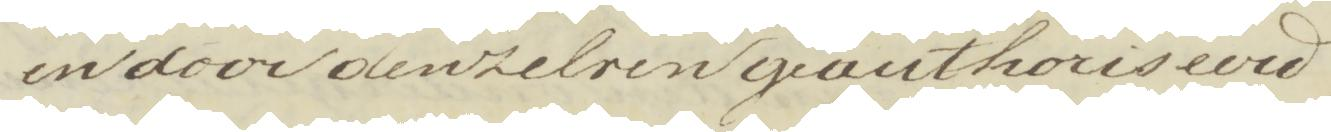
en door denzelven geauthoriseerd
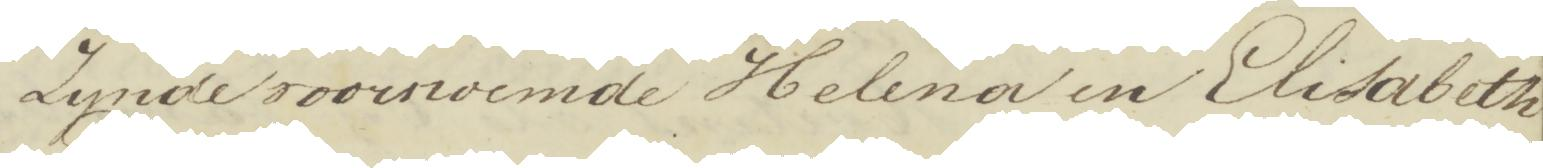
Zynde voornoemde Helena en Elisabeth
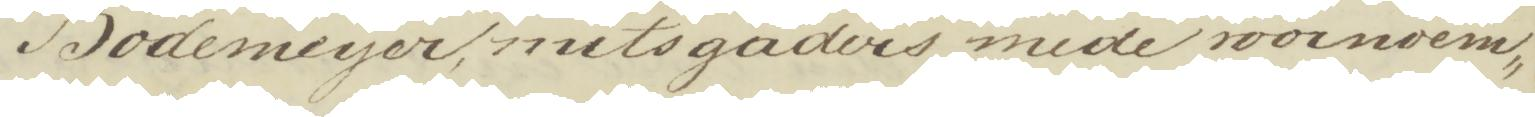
Bodemeyer, mitsgaders mede voornoem„
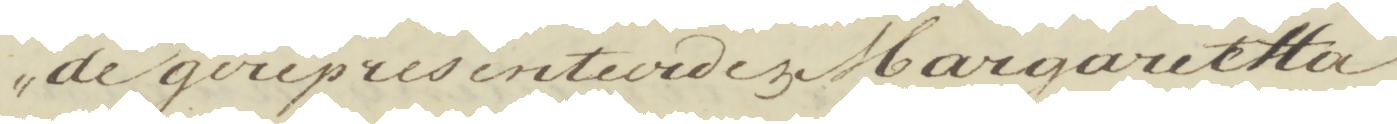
„de gerepresenteerden Margaretta /
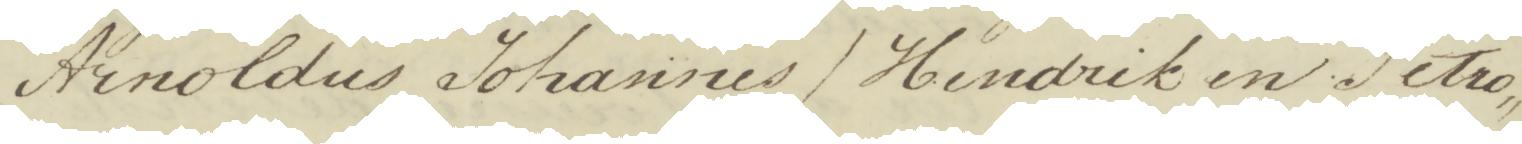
Arnoldus Iohannes / Hendrik en Petro„
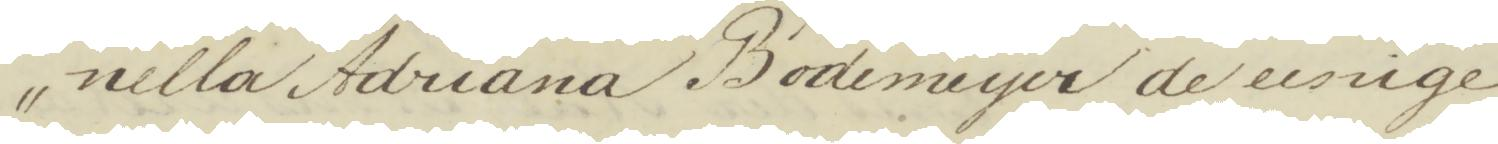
„ nella Adriana Bodemeyer de eenige
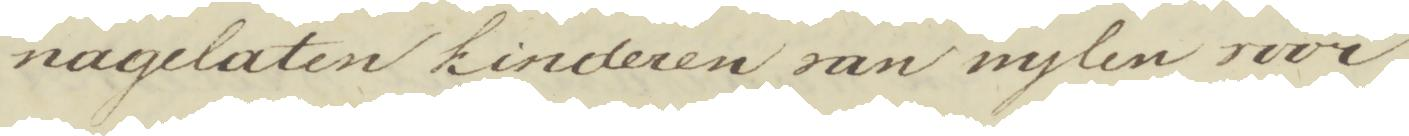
nagelaten kinderen van wylen voor
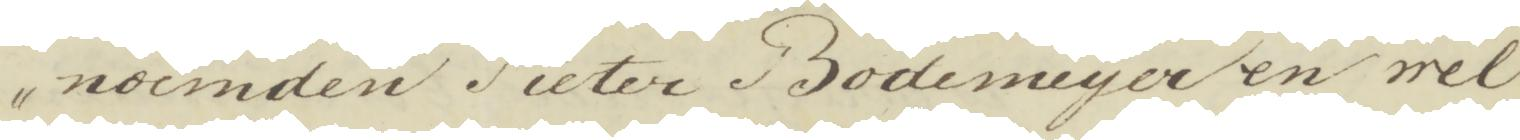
„ noemden Pieter Bodemeyer en wel
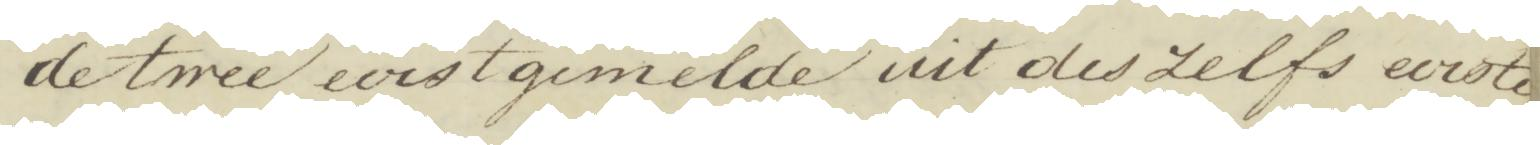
de twee eerstgemelde uit deszelfs eerste
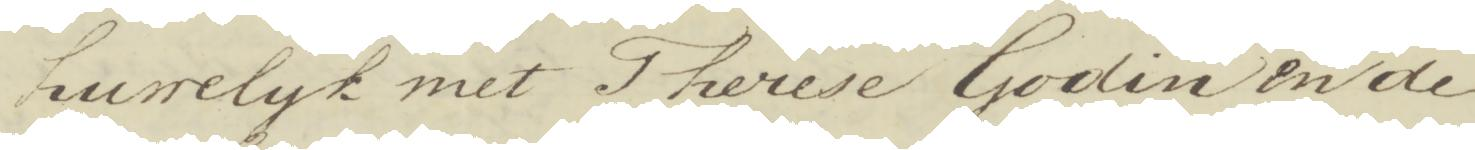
huwelyk met Therese Godin en de
